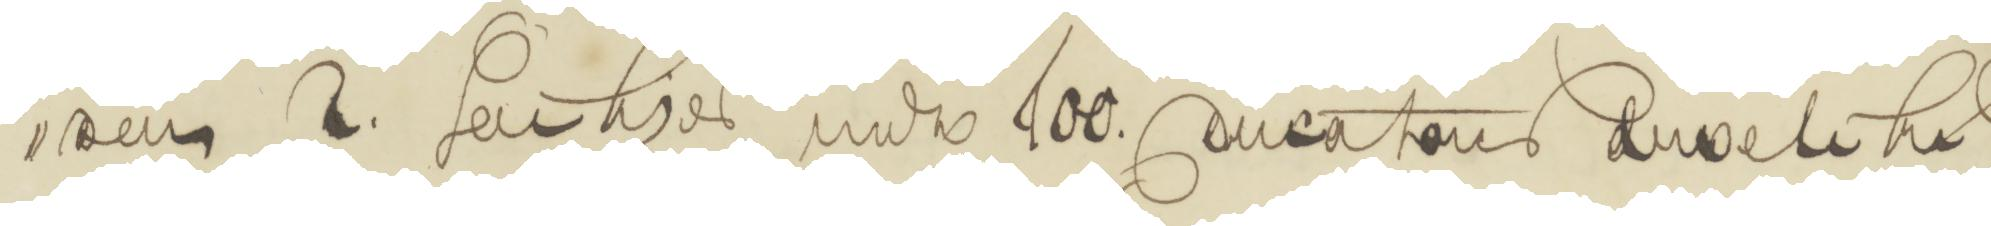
„ven 2. sackjes met 400. ducatons dewelcke
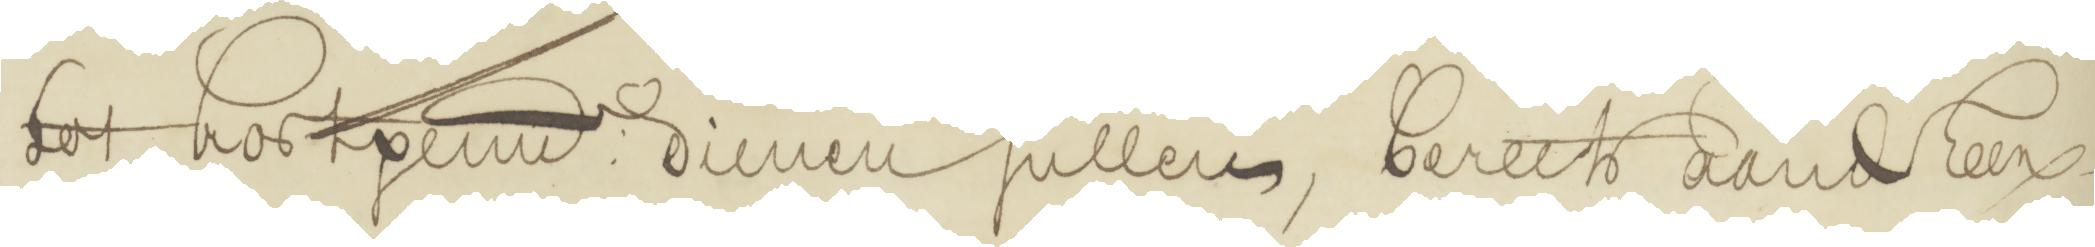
tot kostpenn: dienen sullen, bereets aande heer
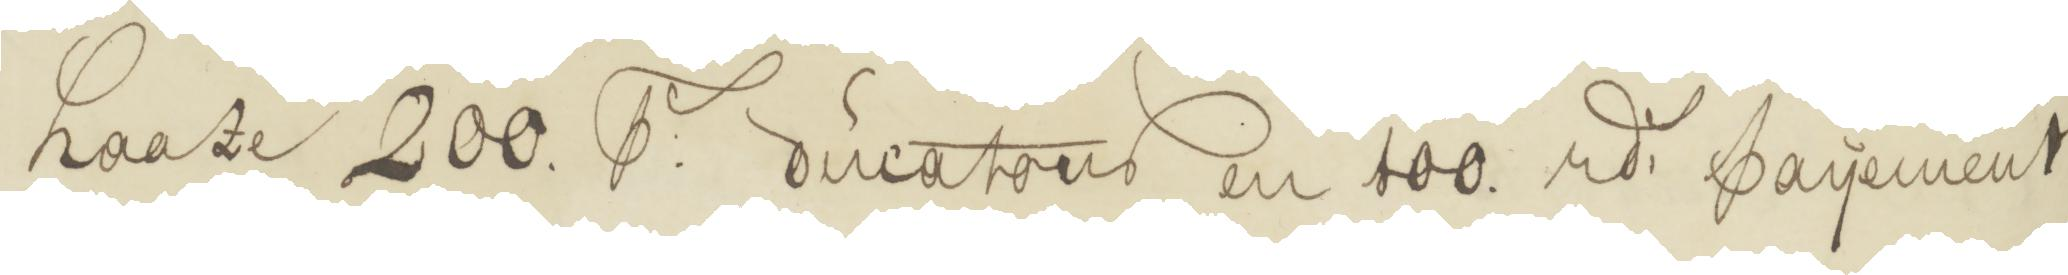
haaze 200. p:s ducatons en 100. rd:s paijement
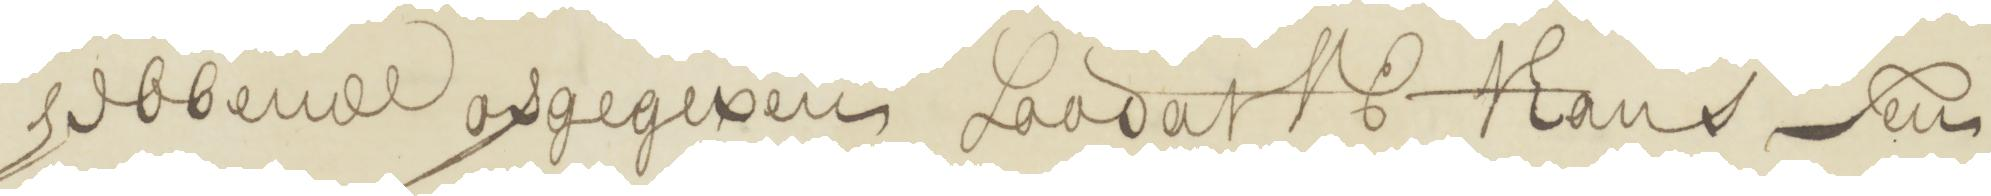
hebbende overgegeven soodat VE thans Een
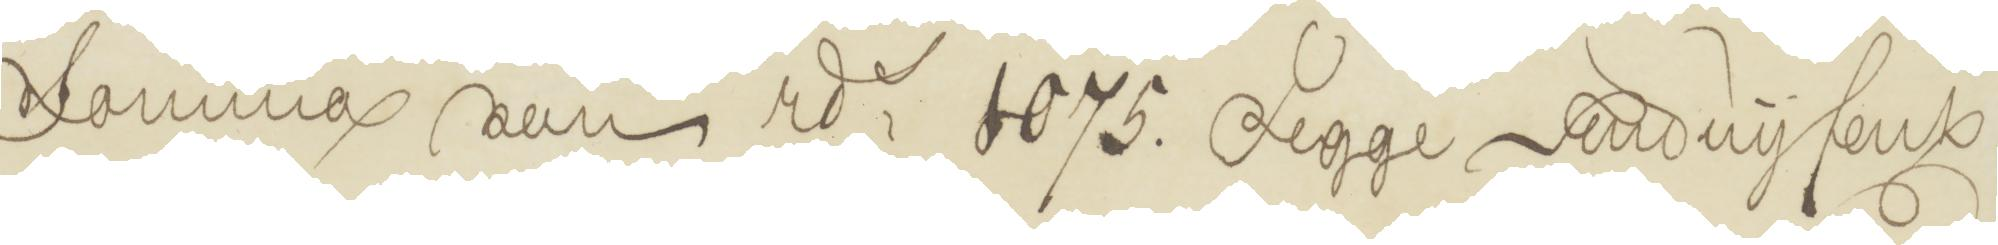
somma van rd:s 1075. zegge Eenduijsent
